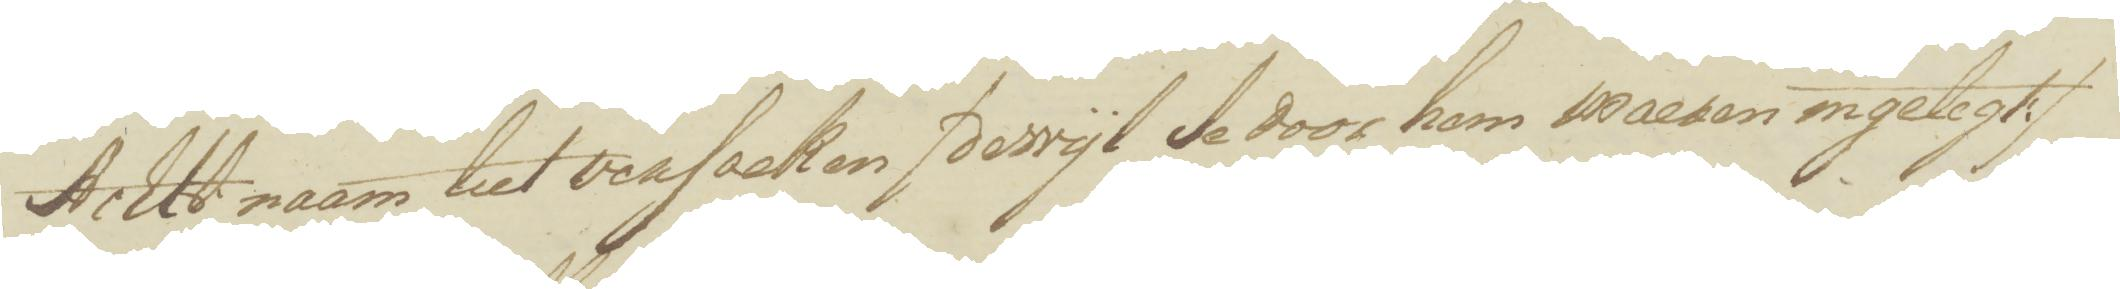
Achtb naam liet versoeken /dewijl se door hem waeren ingelegt:/
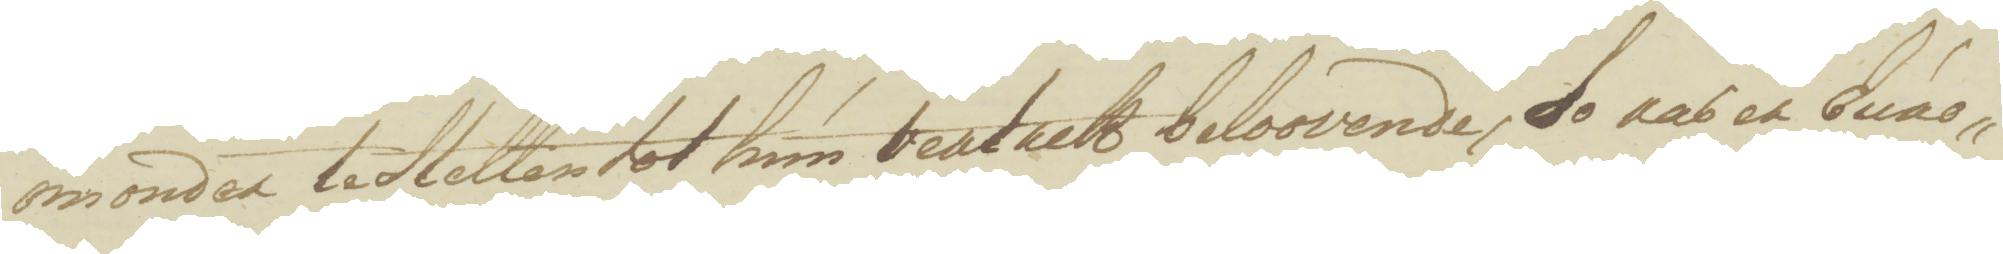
om onder te stellen tot hun vertrek beloovende, so ras er Euro„
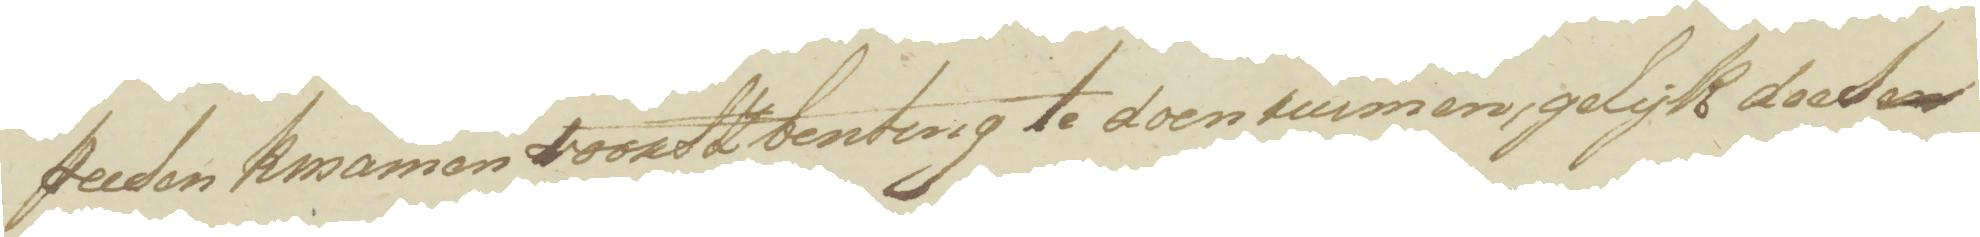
peesen kwamen voorsz benting te doen ruimen, gelijk deesen
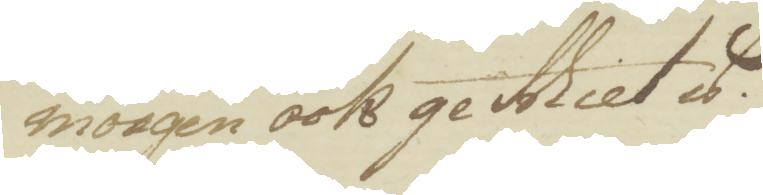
morgen ook geschiet is.
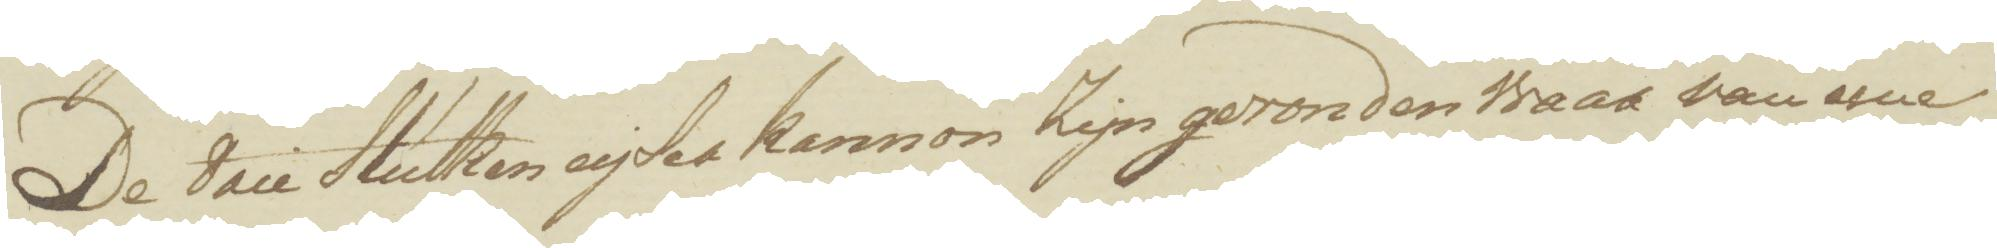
De drie stukken eijser kannon zijn gevonden waar van eene
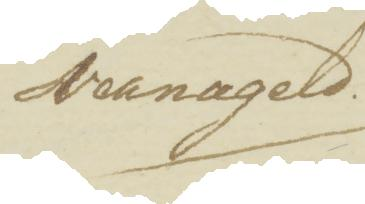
vernageld
